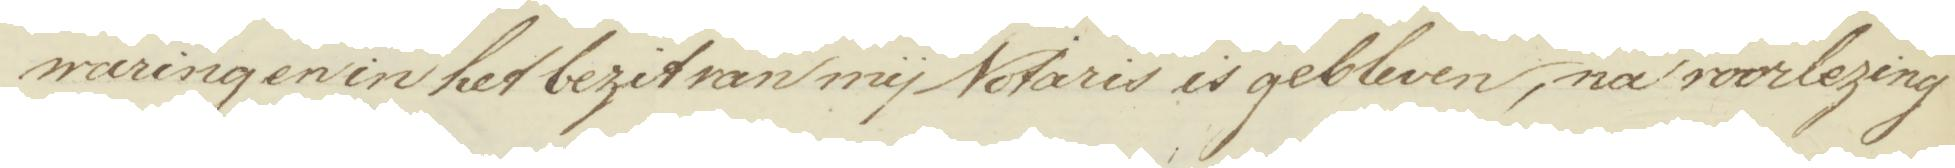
waring en in het bezit van mij Notaris is gebleven, na voorlezing
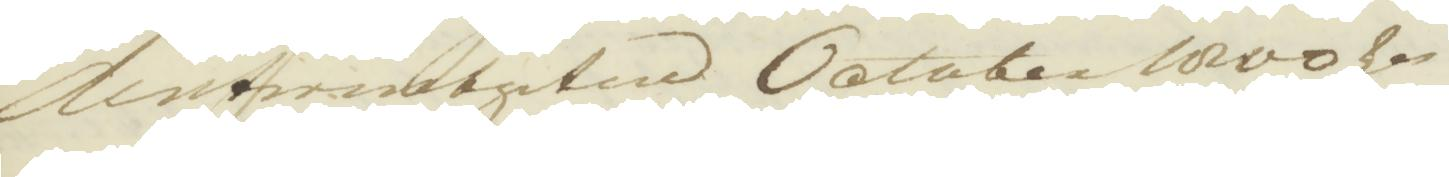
den twintigsten October 1800 Zes
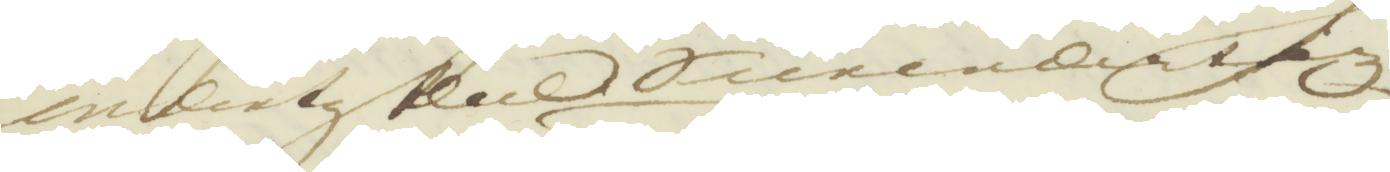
en dertig Deel Vierendertig
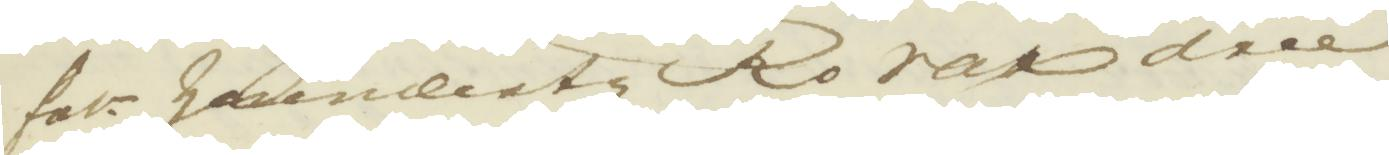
fol.o Zevendertig Ro vak drie
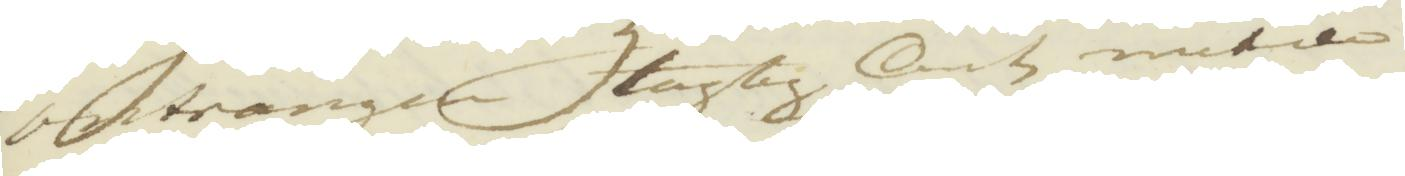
ontvangen tagtig Cents met de
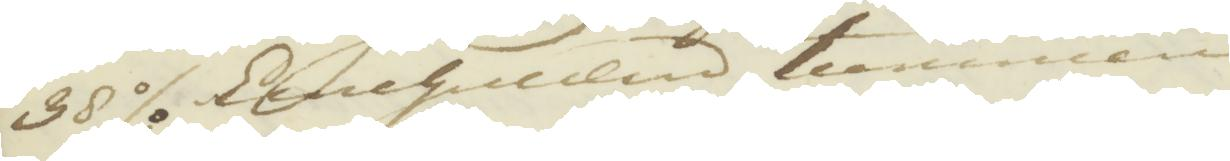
38% Eene gulden tieneneen
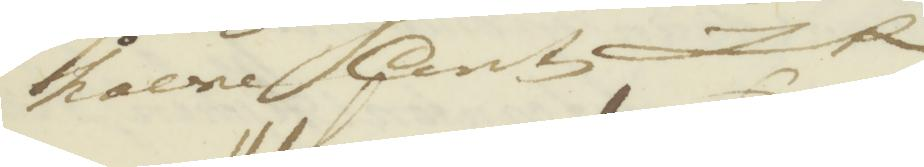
halve Cents ZR
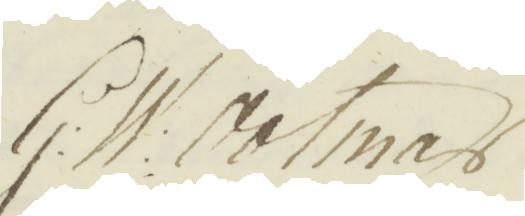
G: W: Ootmar
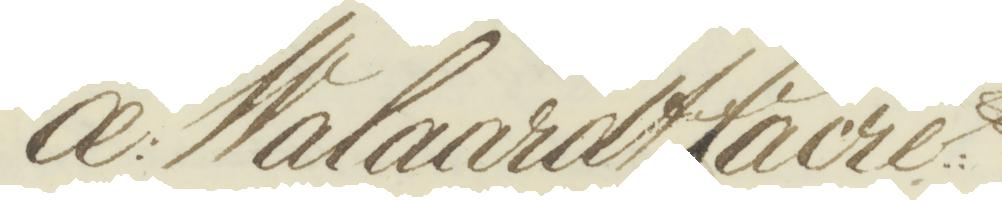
AE: Walaardt Sacré.:
